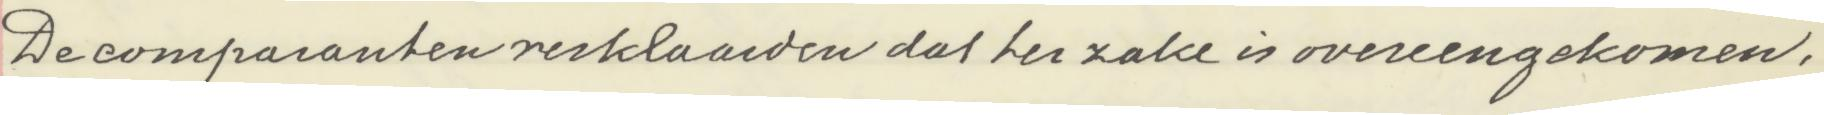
De comparanten verklaarden dat ter zake is overeengekomen,
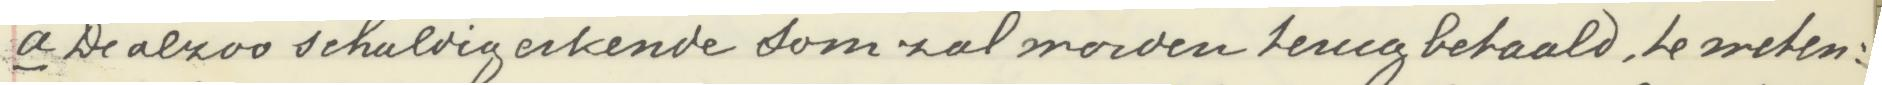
a De alzoo schuldig erkende som zal worden terug betaald, te weten:
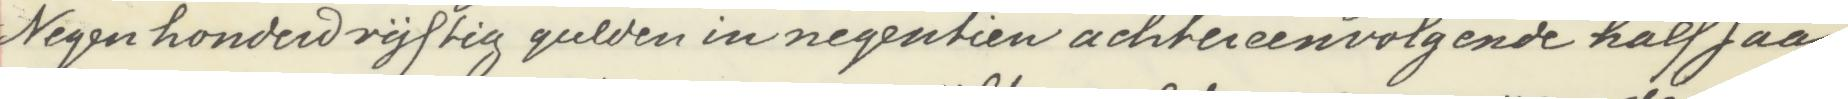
Negen honderd vijftig gulden in negentien achtereenvolgende half Jaar
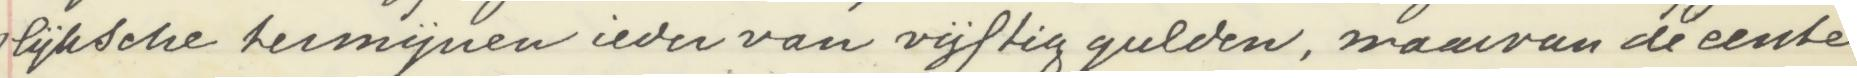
lijksche termijnen ieder van vijftig gulden, waarvan de eerste
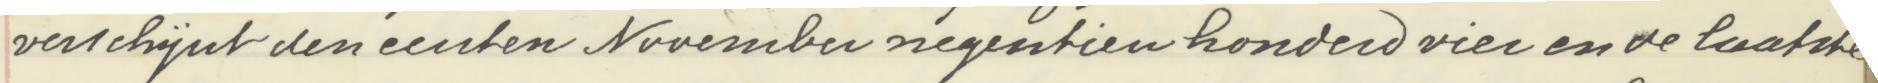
verschijnt den eersten November negentien honderd vier en de laatste
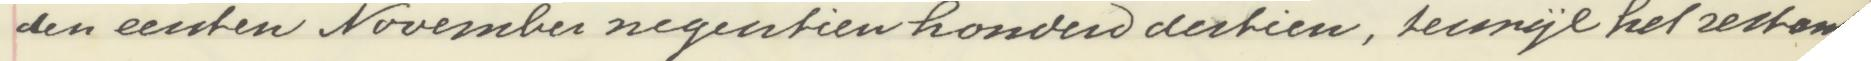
den eersten November negentien honderd dertien, terwijl het restant
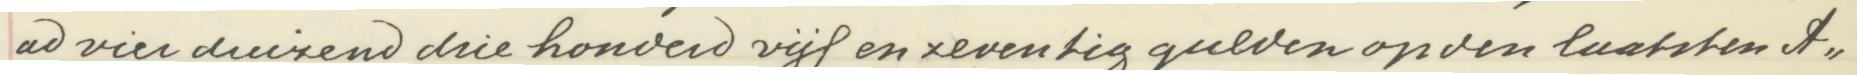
ad vier duizend drie honderd vijf en zeventig gulden op den laatsten A„
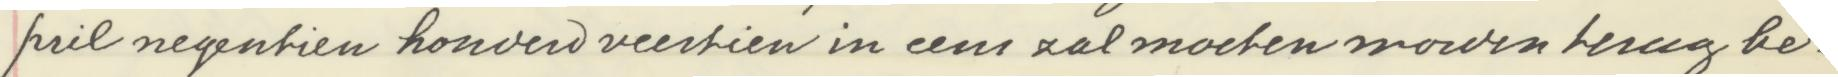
pril negentien honderd veertien in eens zal moeten worden terug be„
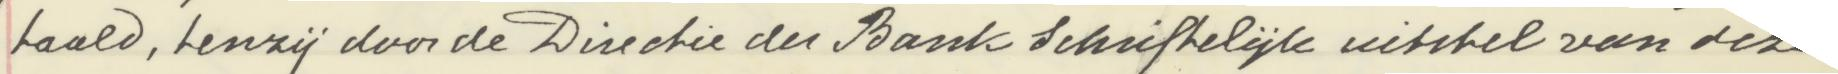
taald, ten zij door de Directie der Bank schriftelijk uitstel van deze
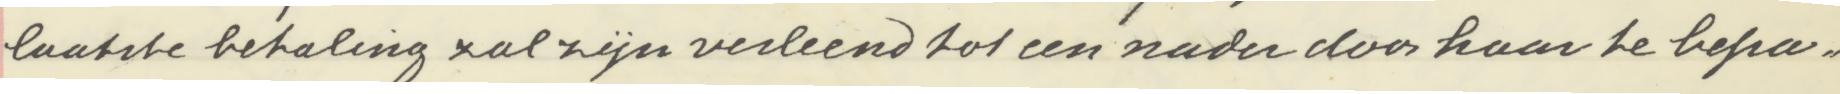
laatste betaling zal zijn verleend tot een nader door haar te bepa„
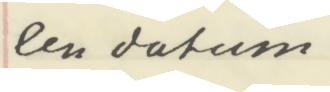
len datum
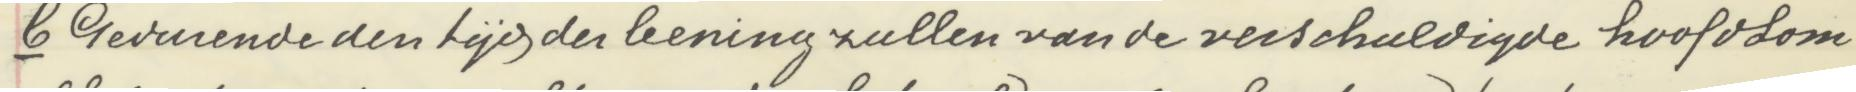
b Gedurende den tijd der leening zullen van de verschuldigde hoofdsom
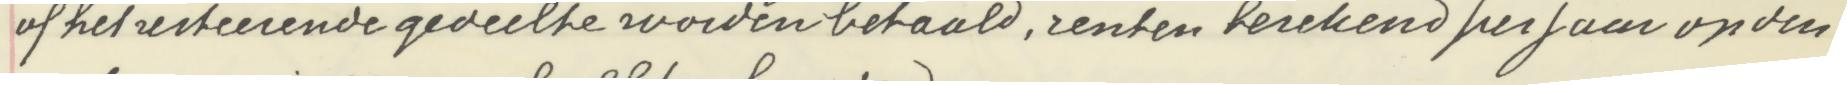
of het resteerende gedeelte worden betaald, renten berekend per jaar op den
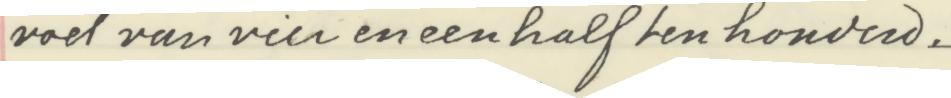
voet van vier en een half ten honderd.
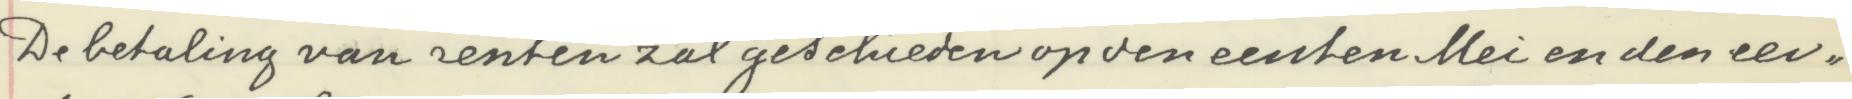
De betaling van renten zal geschieden op den eersten Mei en den eer„
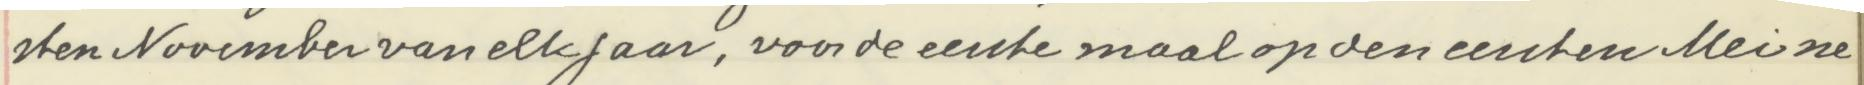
sten November van elk jaar, voor de eerste maal op den eersten Mei ne
